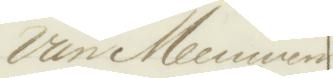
van Meeuwen
